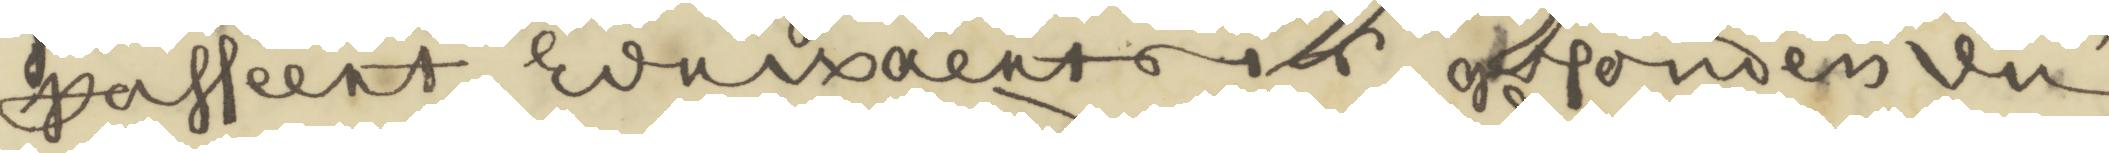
passeert herwaerts is gesonden en
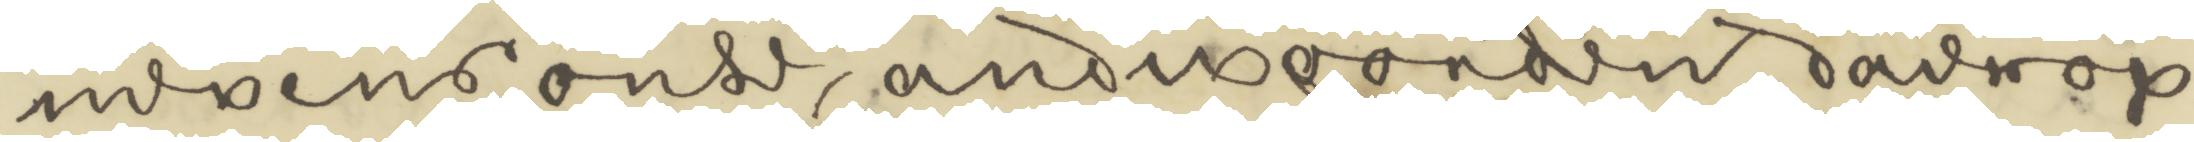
nevens onse, andwoorden daer op
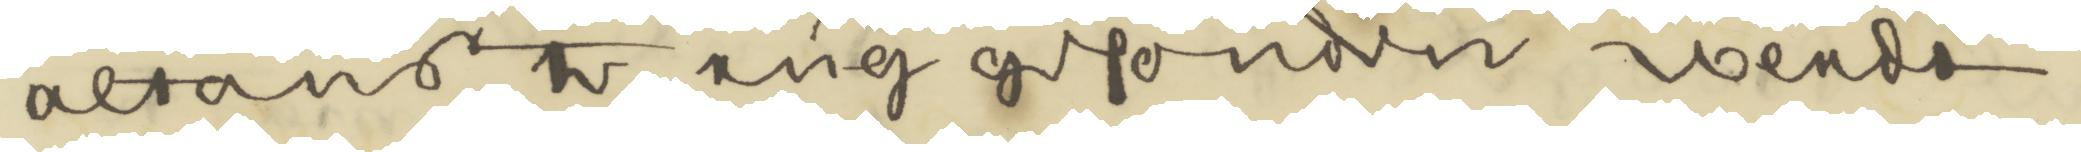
altans te rug gesonden werdt.
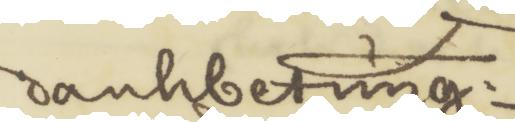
dankbetuijg.
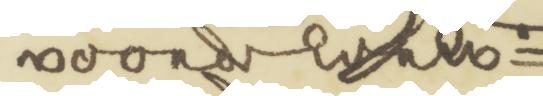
voorde herw=ts
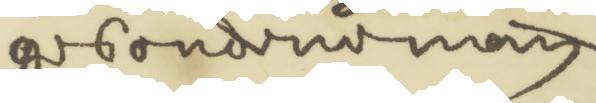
gesondene man
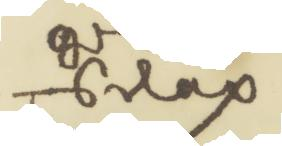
schap
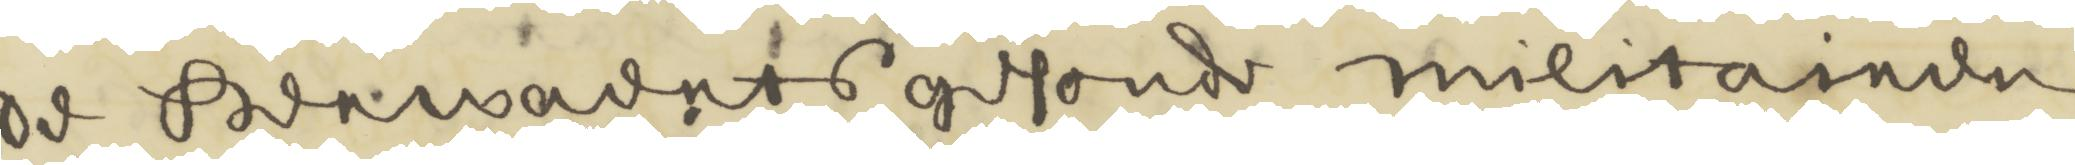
de Herwaerts gesonde militairen
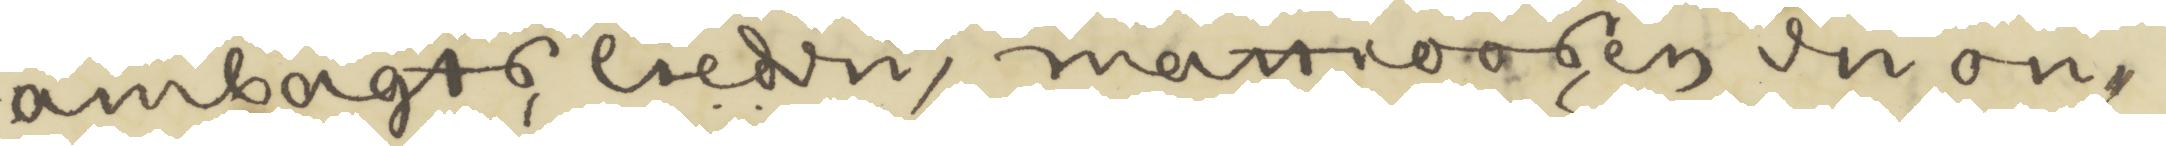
ambagts lieden, mattroosen en on„
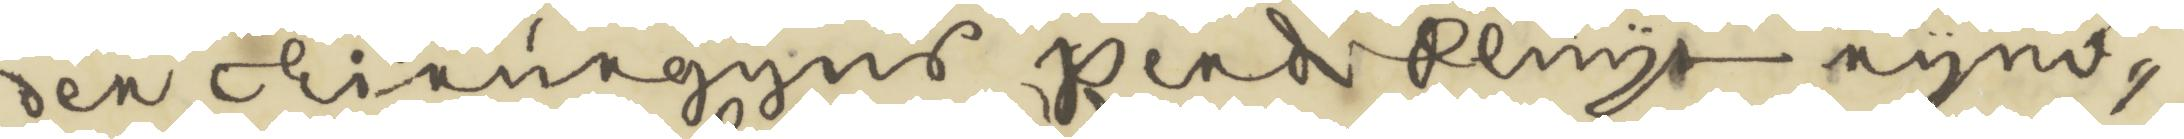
der chirurgijns per de fluijt rijne„
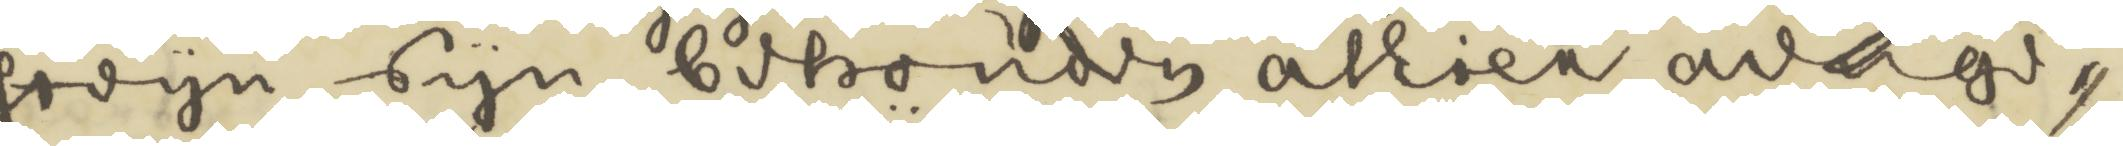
steijn sijn behouden alhier aen ge„
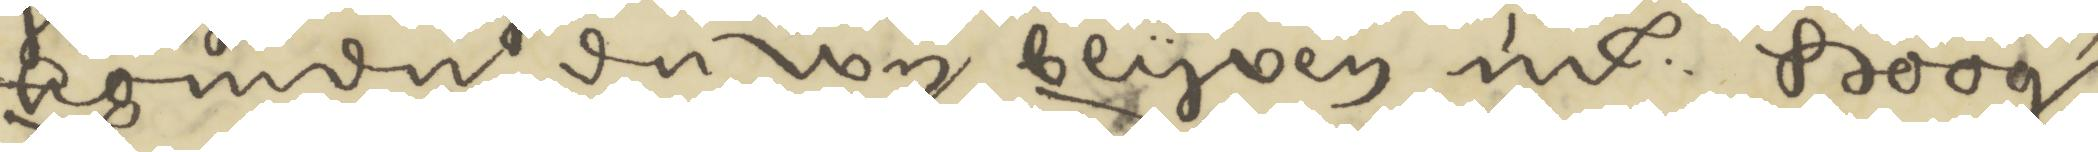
komen en wij blijven uE: Hoog
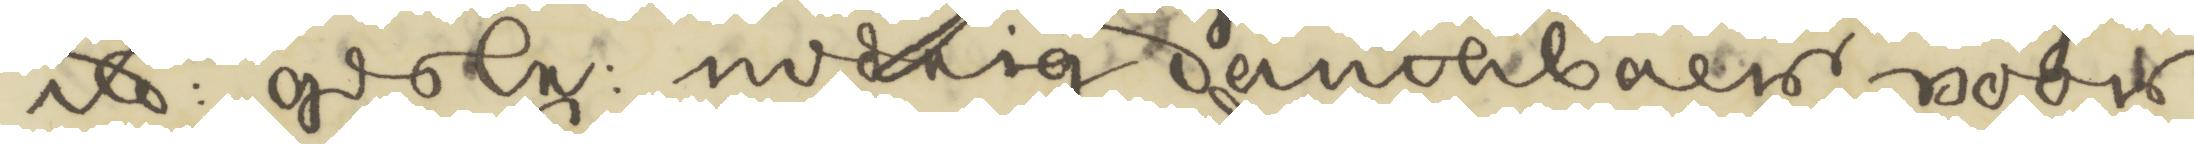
Ed: gestr: nedrig danckbaers voor
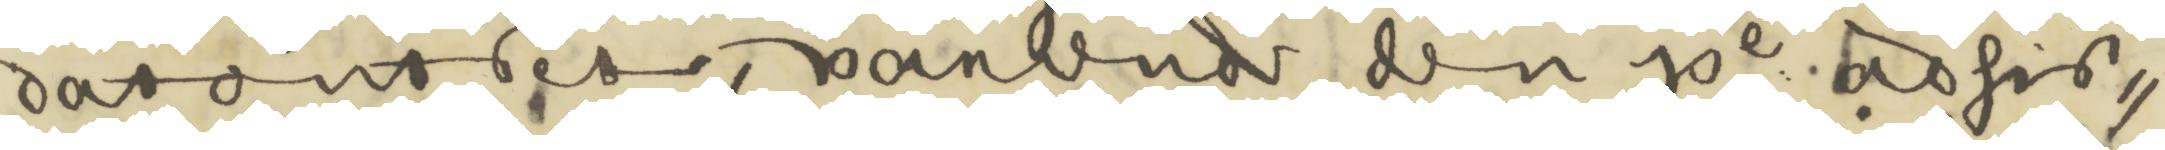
dat ontset, varende den p:l adsis„
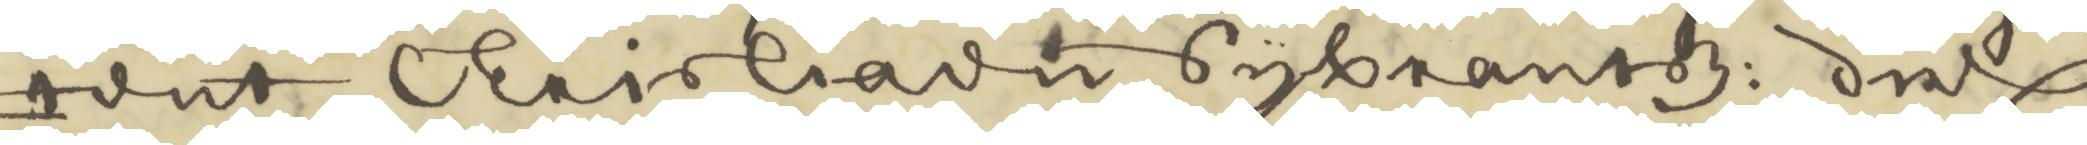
tent Christiaen sijbrantsz: die
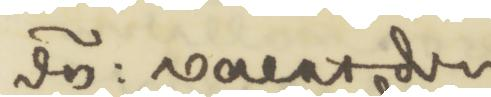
ende: vaert den
